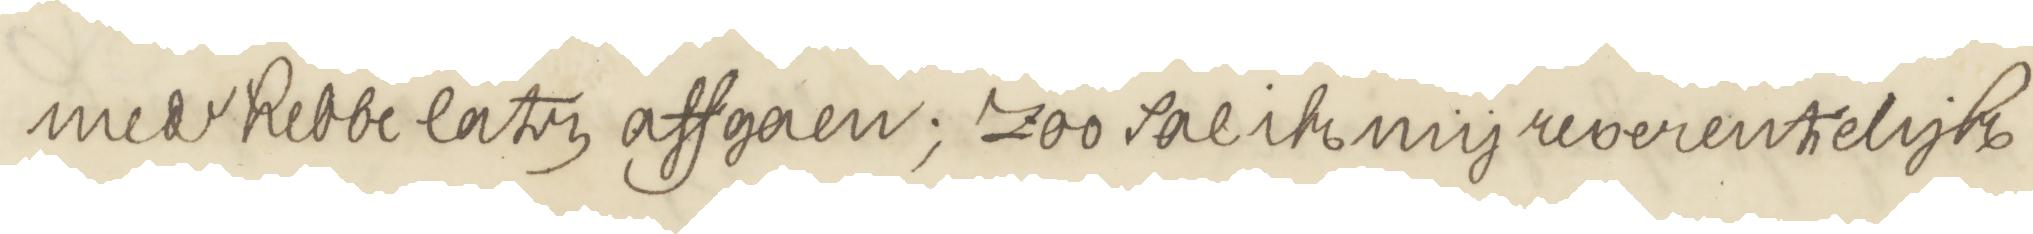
mede hebbe laten affgaen; zoo sal ik mij reverentelijk
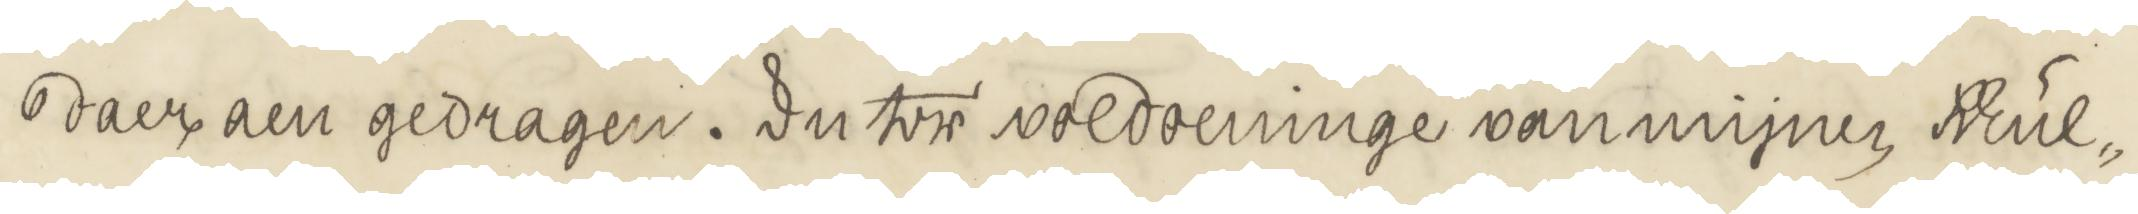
daer aen gedragen. En ter voldoeninge van mijnen schul„
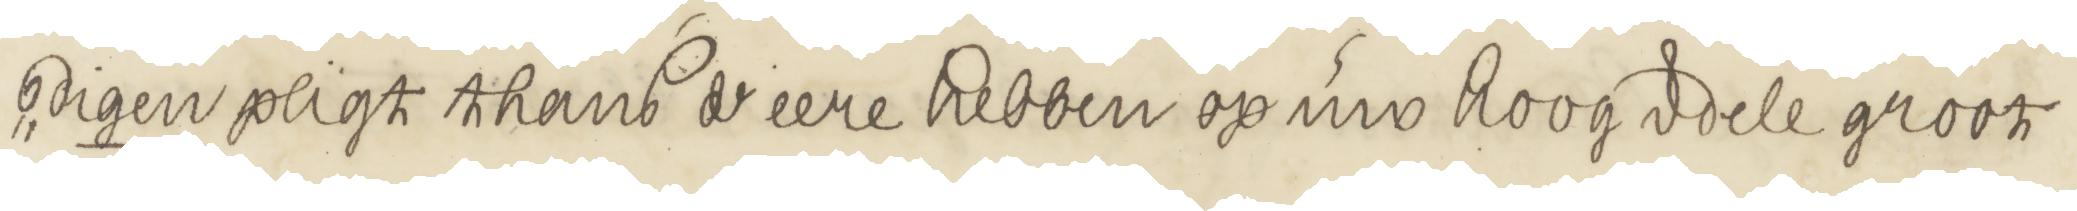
„digen pligt thans de eere hebben op uw hoog Edele groot
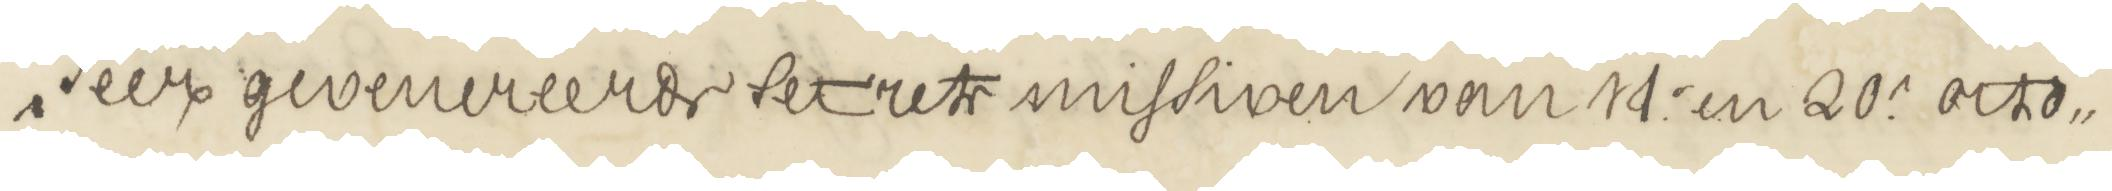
^ seer gevenereerde secrete missiven van 14.' en 20.' octo„
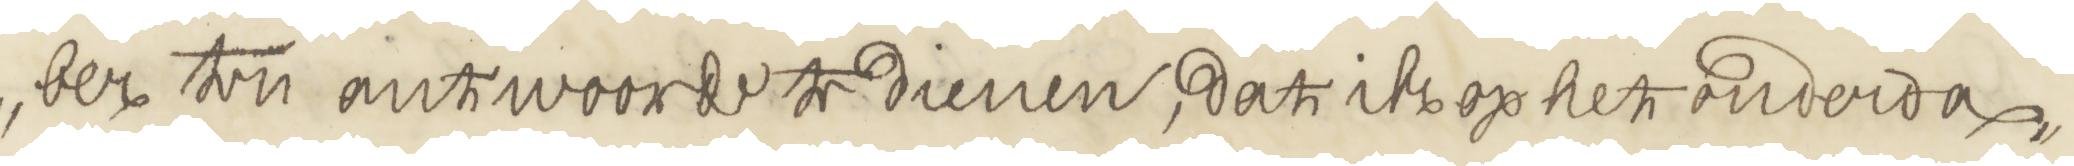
„ber ten antwoorde te dienen, dat ik op het onderda„
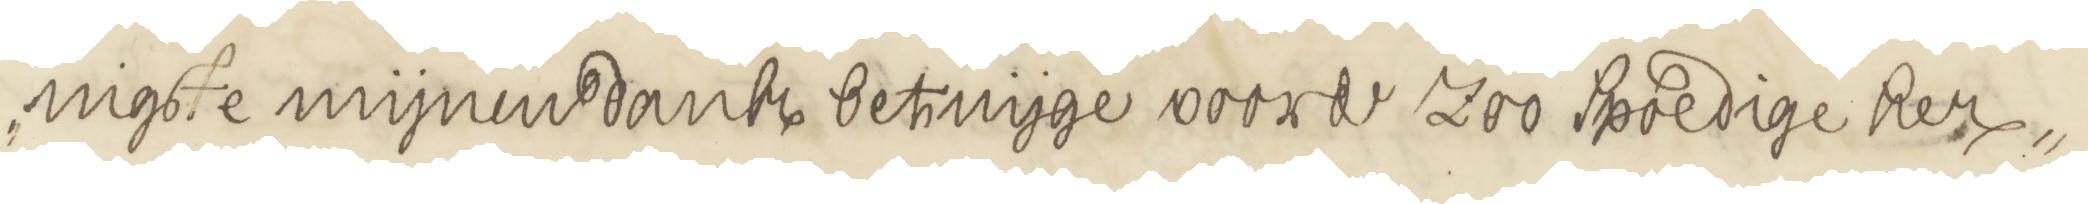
„nigste mijnen dank betuijge voorde zoo spoedige her„
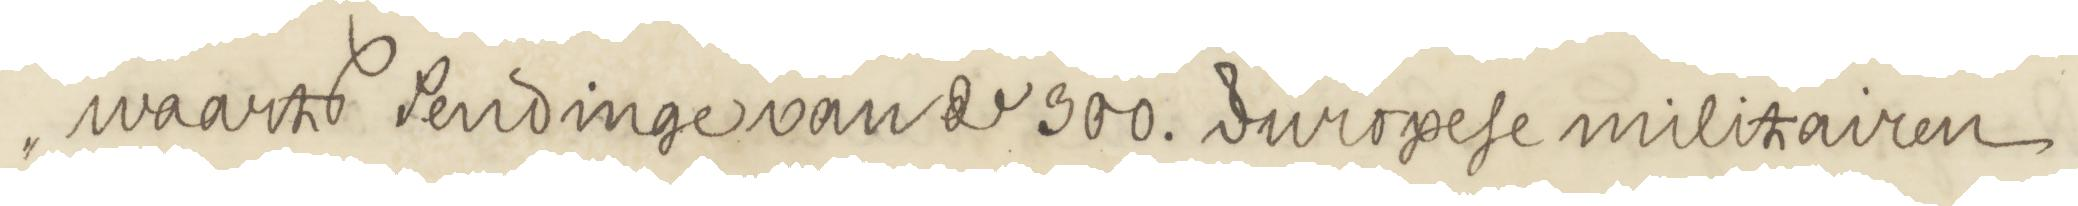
„waarts sendinge van de 300. Europese militairen
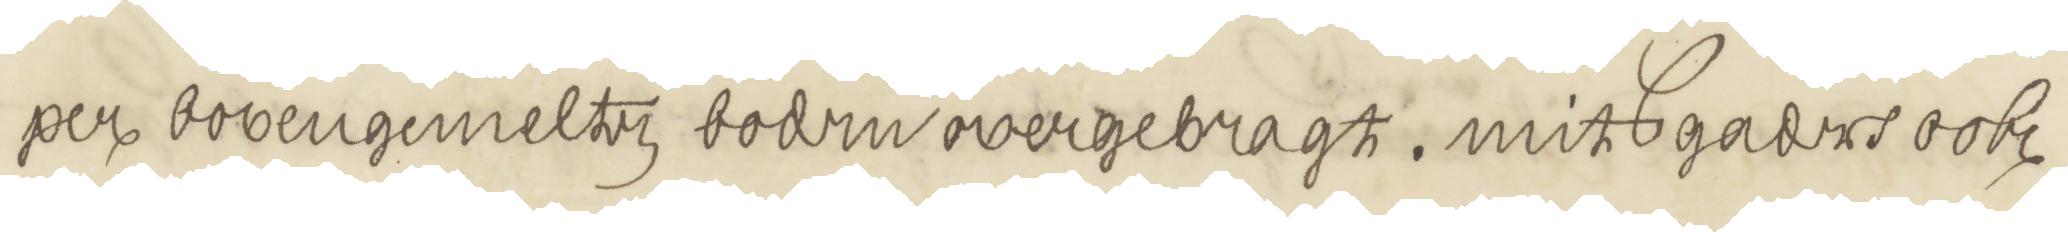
per bovengemelten bodem overgebragt, mitsgaders ook
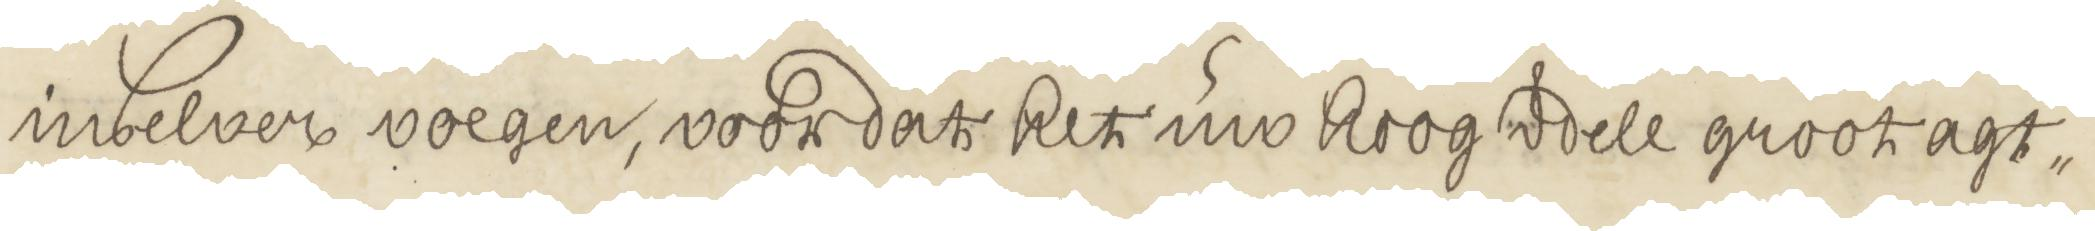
inselver voegen, voor dat het uw hoog Edele groot agt„
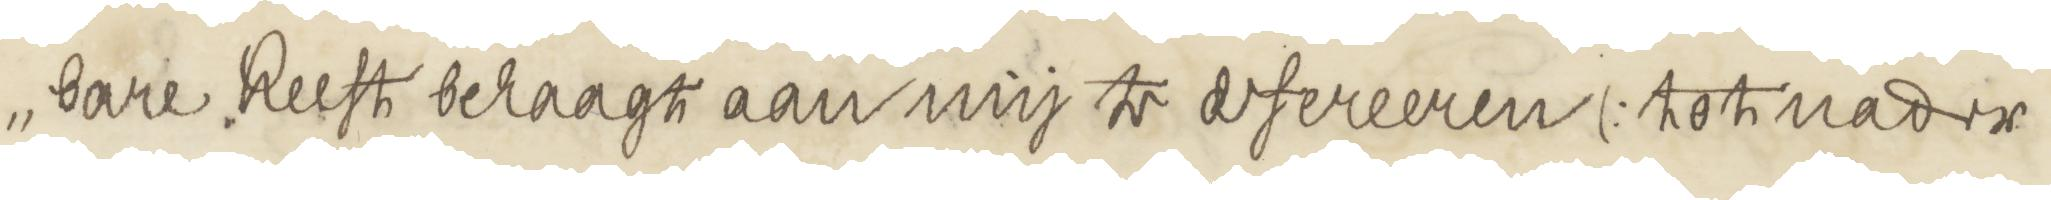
„bare heeft behaagt aan mij te defereeren (:tot nader
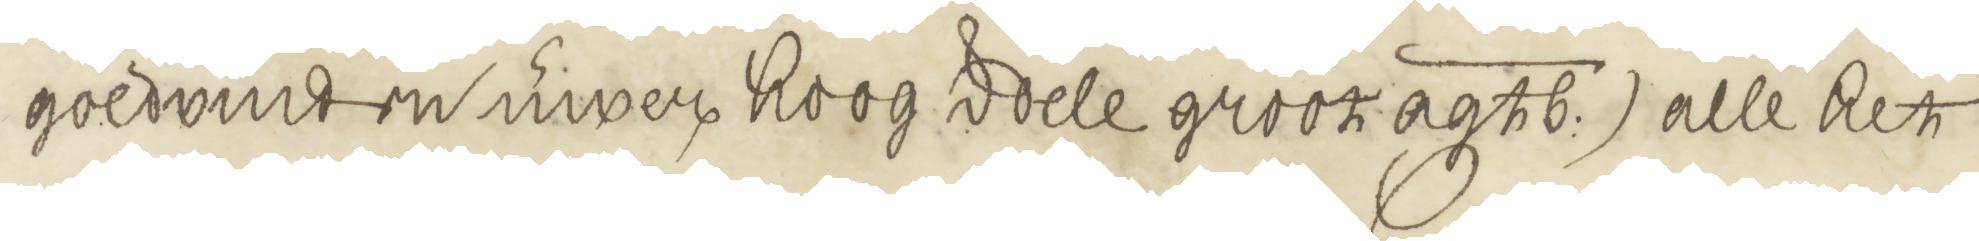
goedvinden uwer hoog Edele groot agtb:) alle het
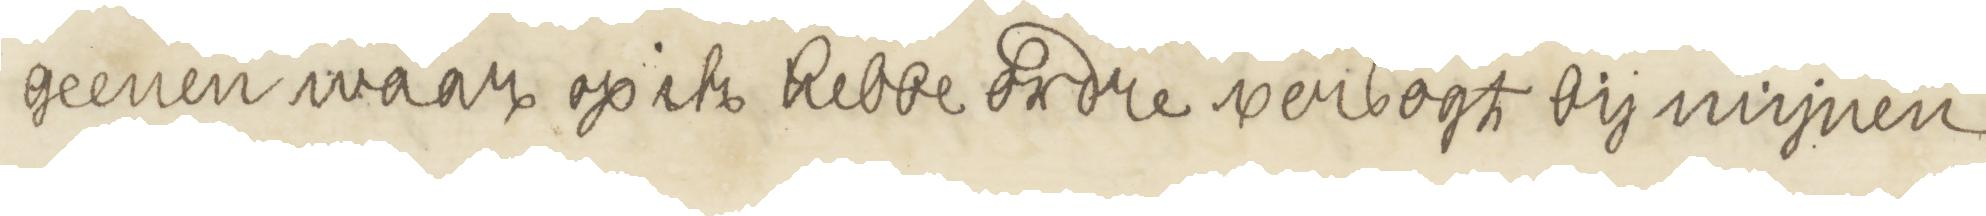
geenen waar op ik hebbe ordre versogt bij mijnen
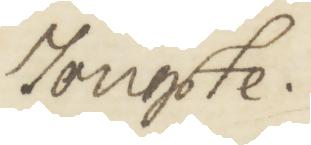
Iongste.
